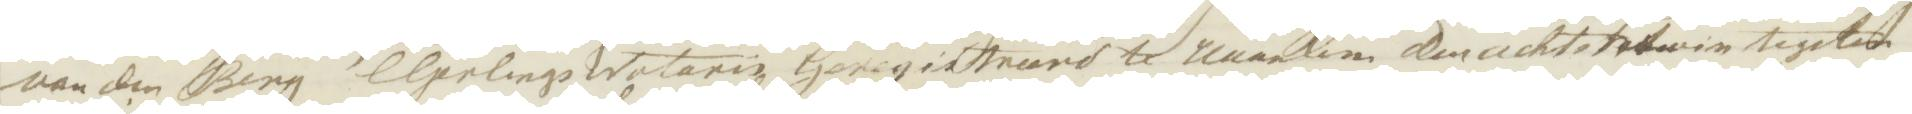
van den Berg C Gerlings Notaris Geregistreerd te Haarlem den achtentwintigsten
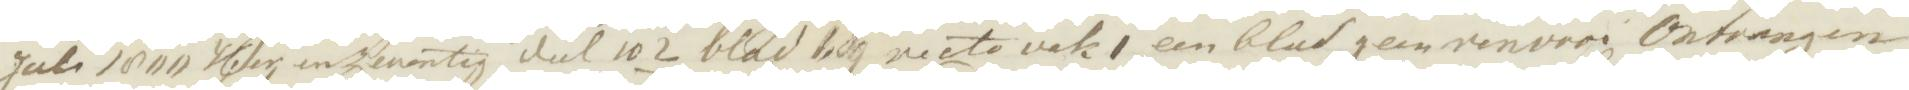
Juli 1800 Vier en zeventig deel 102 blad 609 recto vak 1 een blad geen renvooi Ontvangen
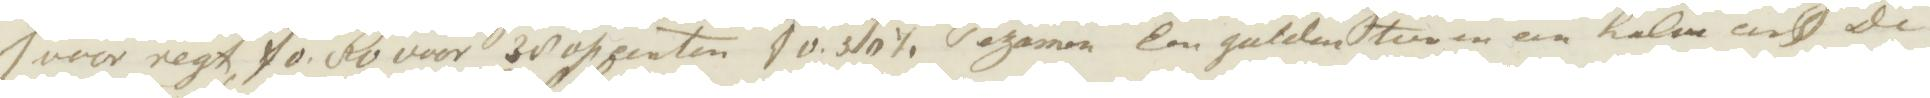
voor regt, ƒ0. 80 voor 38 opcenten ƒ 0.30½ Tezamen Een gulden tien en een halve cent De
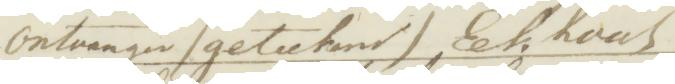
ontvanger (geteekend) Eekhout
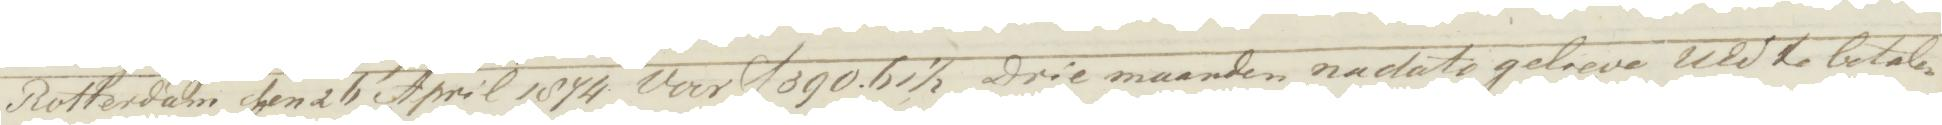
Rotterdam den 26 April 1874 Voor ƒ390.61½ Drie maanden na dato gelieve UEd te betalen
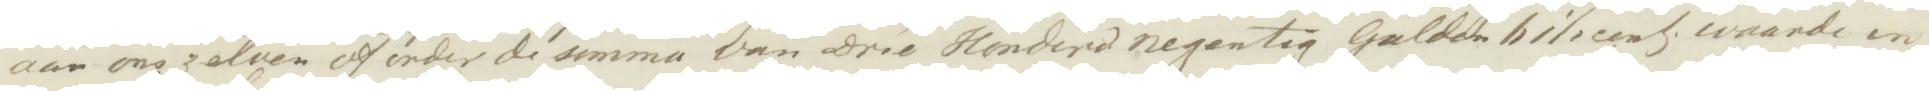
aan ons zelven of onder de somma van Drie Honderd negentig Gulden 61½ cent waarde in
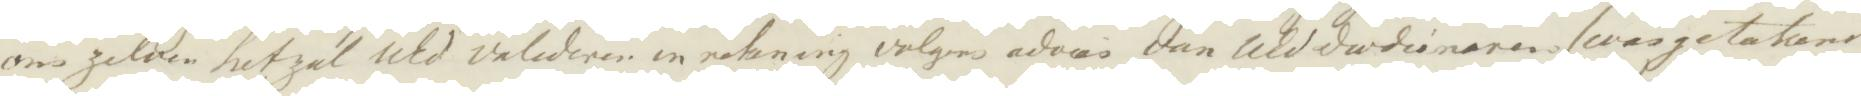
ons zelven het zal UEd valideren in rekening volgens advies van UEd dwdienaren (was geteekend)
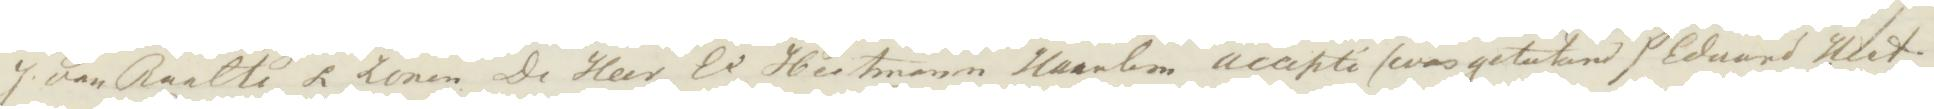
J. van Raalts & Zonen De Heer E Heitmann Haarlem accepté (was geteekend) Eduard Heit
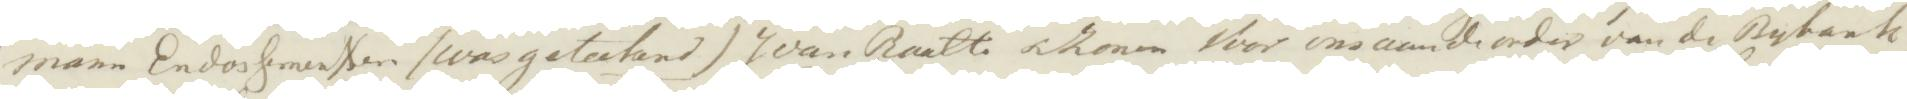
mann Endossmenten (was geteekend) J van Raalte & Zonen Voor ons aan de order van de Bybank
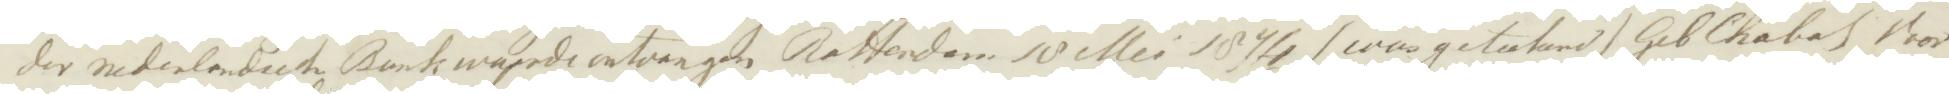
der nederlansche, Bank waarde ontvangen Rotterdam 18 Mei 1874 (was geteekend) Geb Chabas Voor
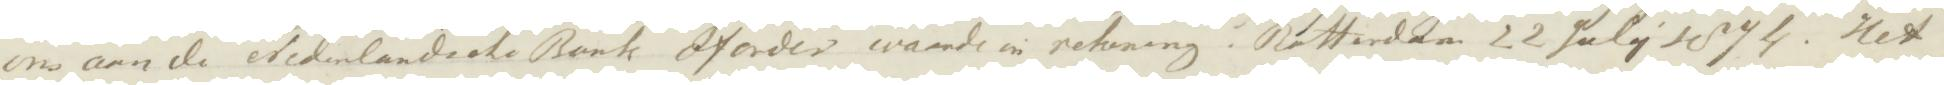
ons aan de Nederlandsche Bank of order waarde in rekening. Rotterdam 22 Julij 1874. Het
